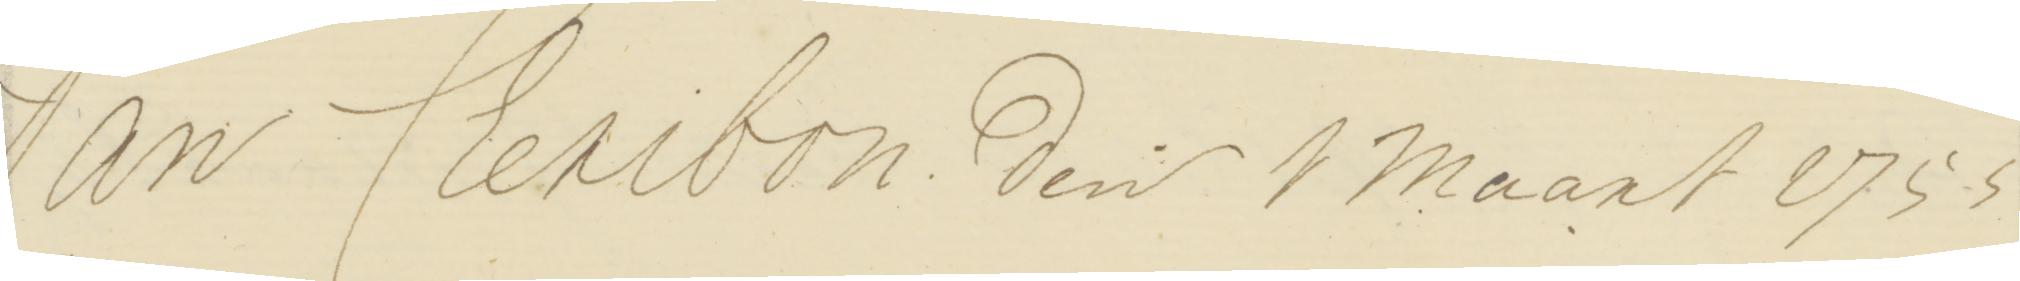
Van Cheribon den 1 Maart 1755
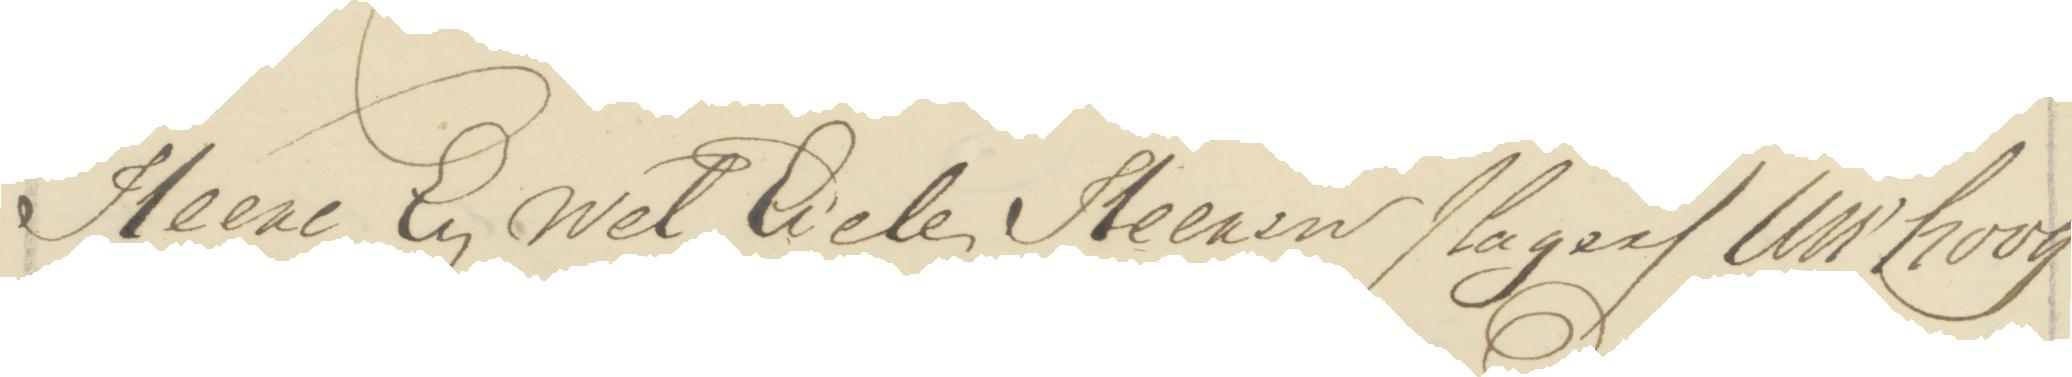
Heere En wel Edele Heeren /lager/ UW hoog
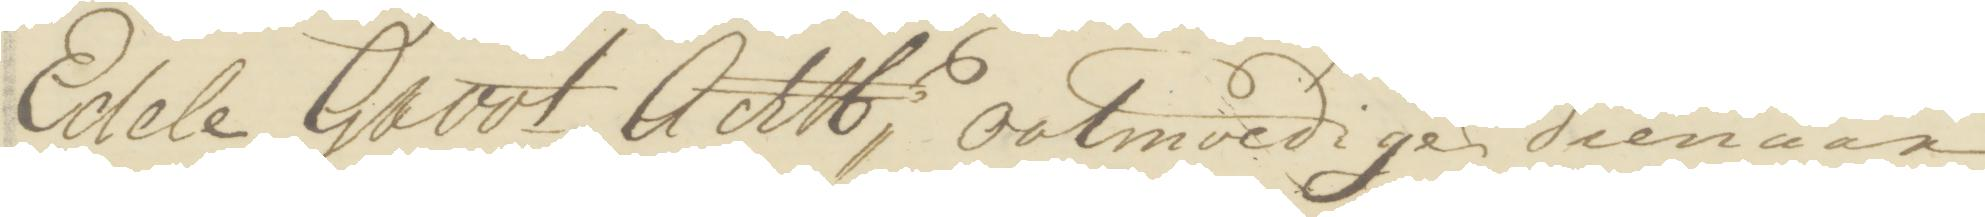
Edele, Groot, Achtb„' ootmoedige dienaar
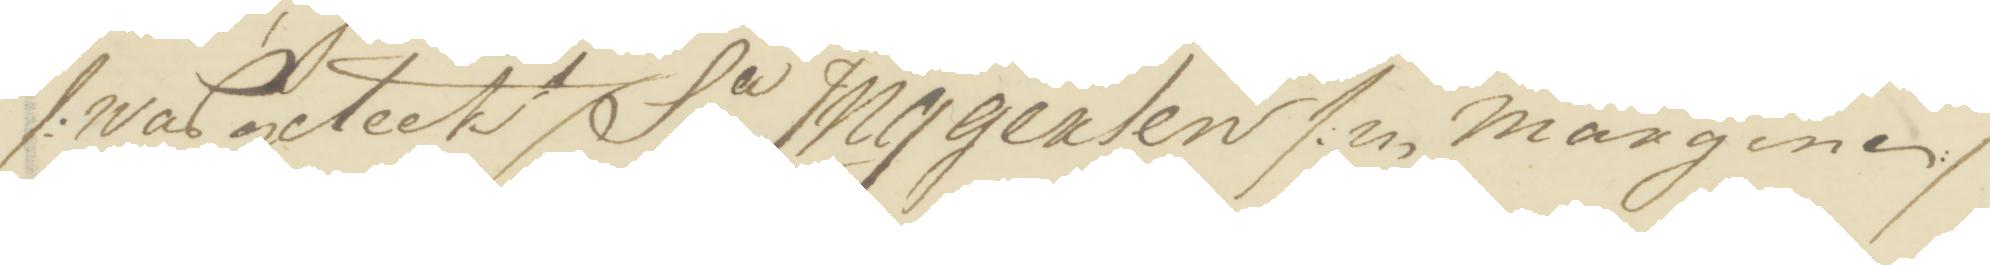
/:was geteekt/ s:a Jnggersen/: in margine:/
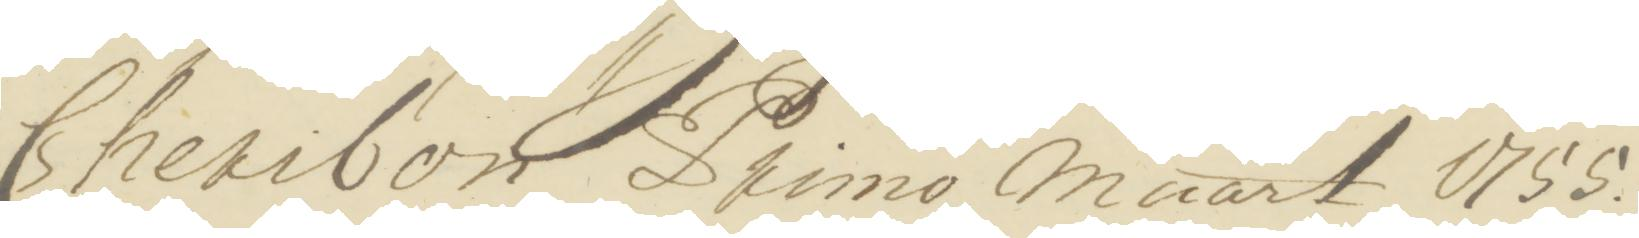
Cheribon Primo maart 1755.
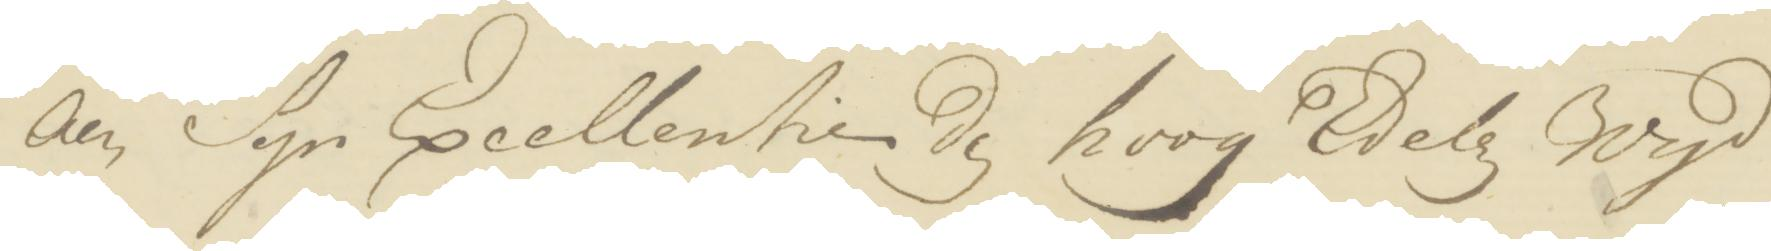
Aen sijn Excellentie den hoog Edelen wyd
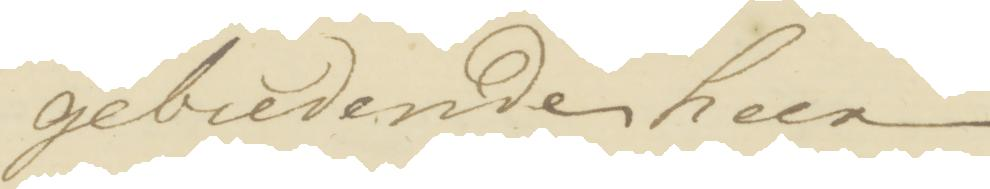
gebiedende heer
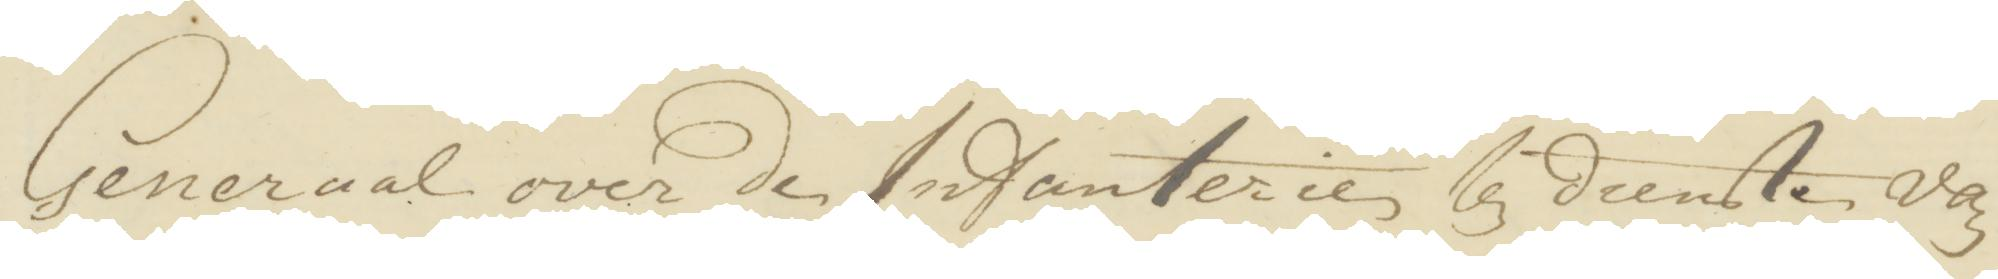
Generaal over de Jnfanterie ten dienste van
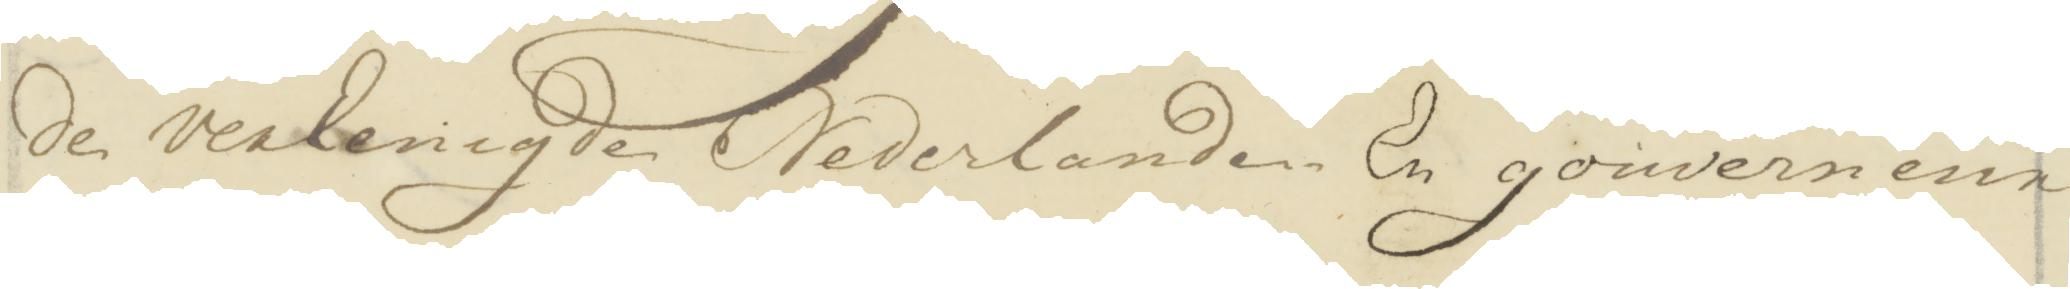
de vereenigde Nederlanden En gouverneur
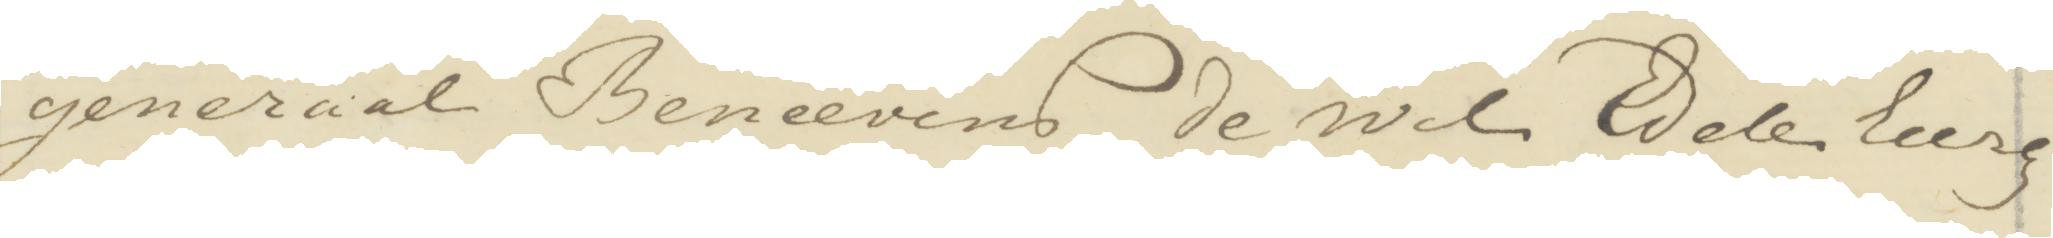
generaal Beneevens de wel Edele heeren
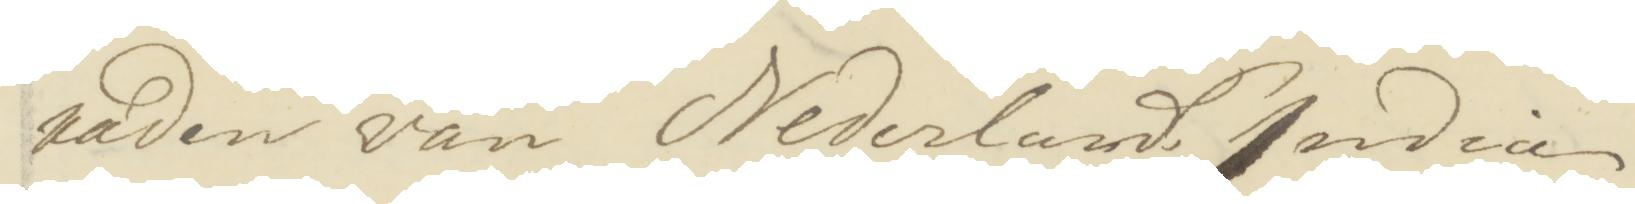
raden van Nederland Jndia
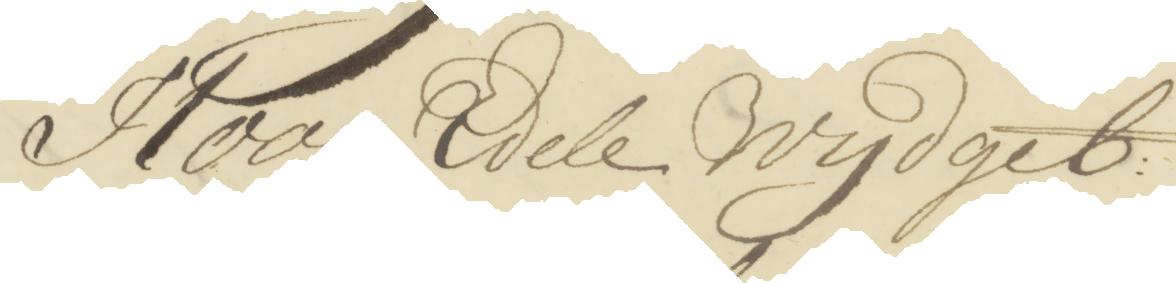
Hoog Edele wydgeb:
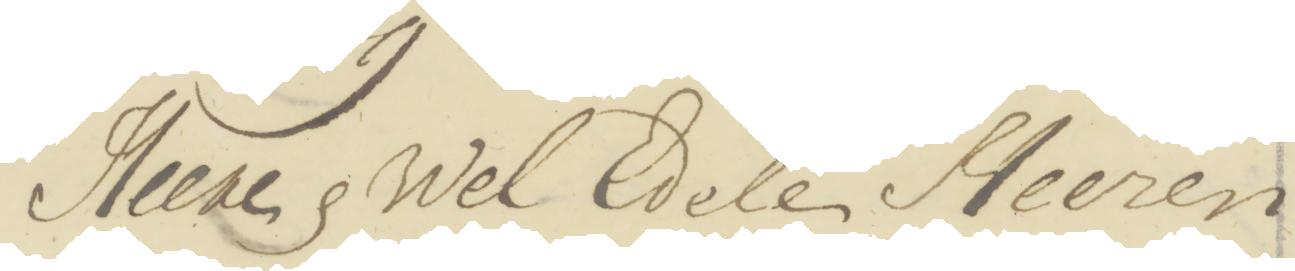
Heere en wel Edele Heeren
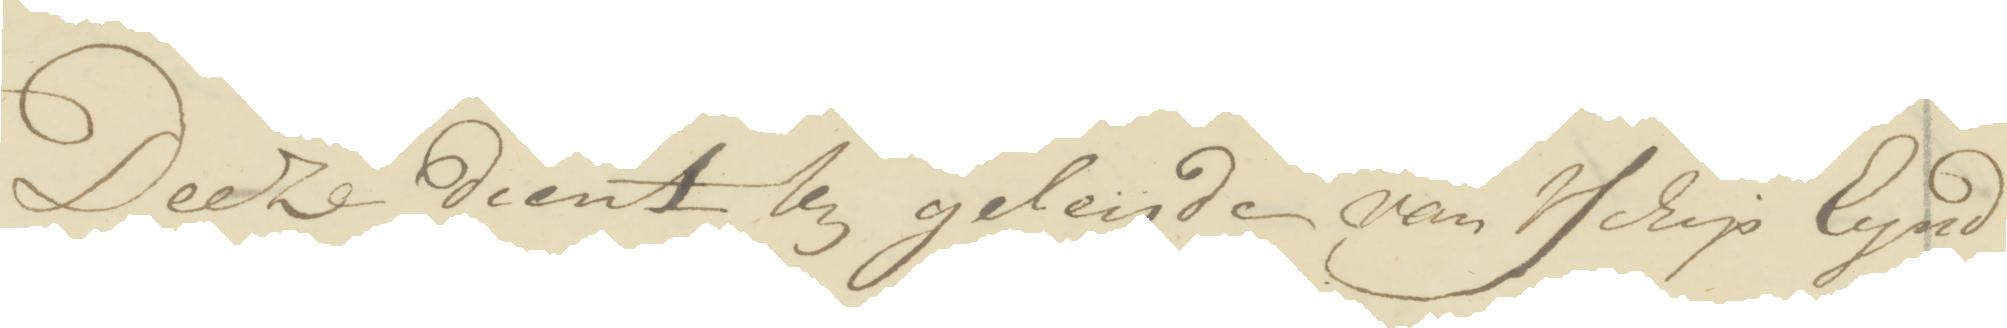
Deeze dient ten geleijde van tschip Eynd
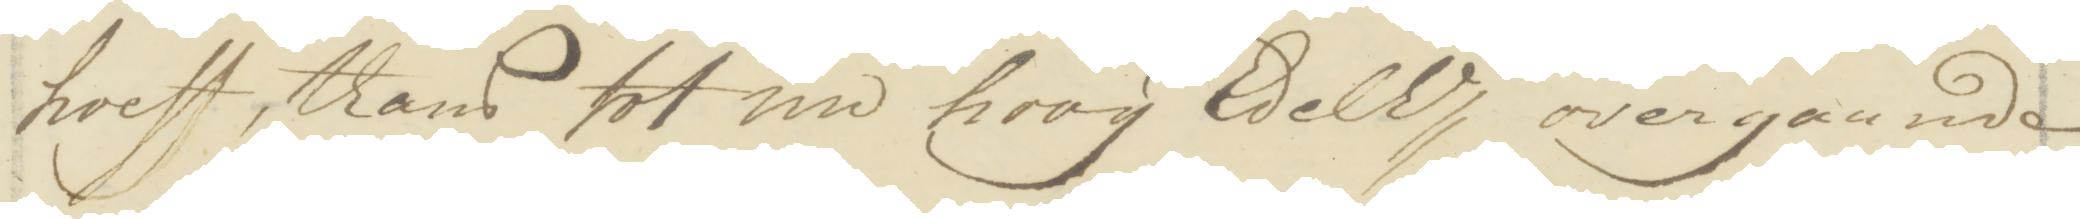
hoeff, thans tot uw hoog Edelh„ overgaande
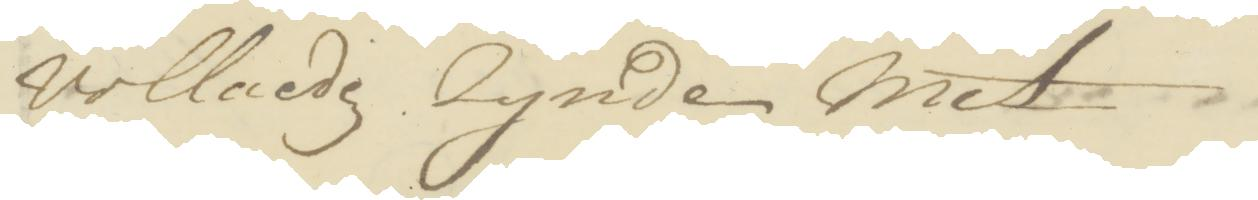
vollaeden zynde met
